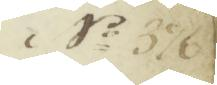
N:o 376
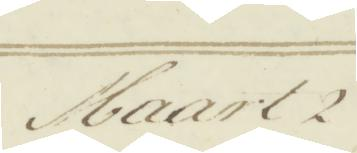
Maart 2
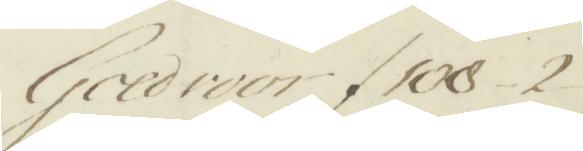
Goed voor ƒ 108 -2
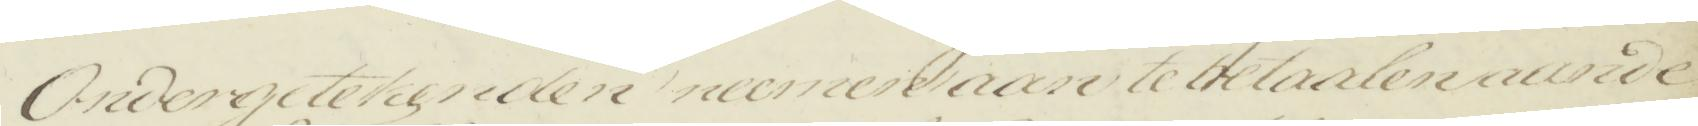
Ondergetekenden neemen aan te betaalen aan de
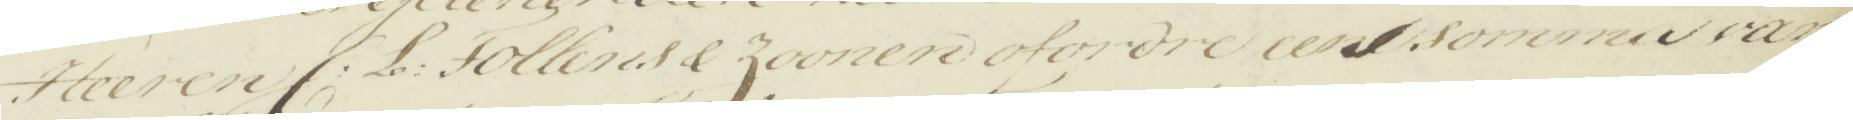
Heeren C: L: Tollens & zoonen of ordre cent somma van
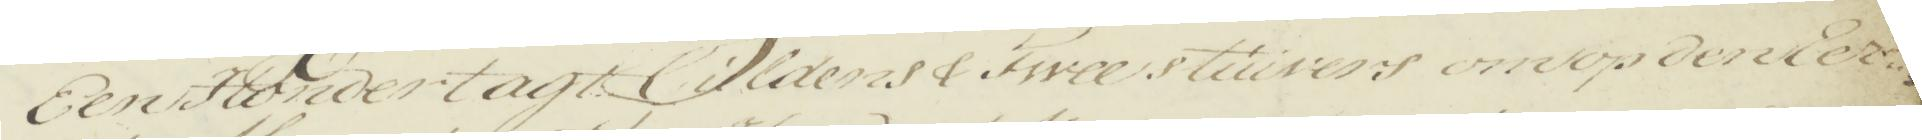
Een Hondert agt Guldens & Twee stuivers om op den Eer„
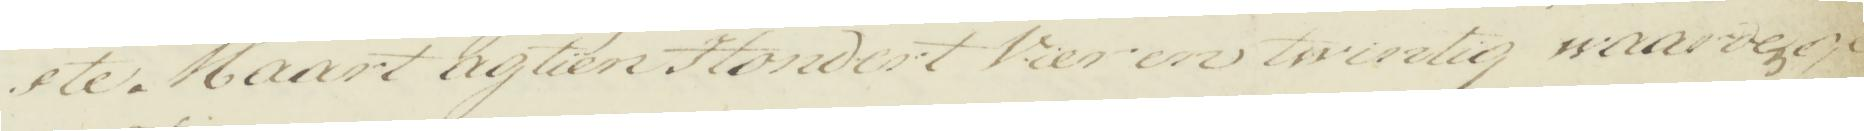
ste Maart agtien Hondert Vier en twintig, waarden ge
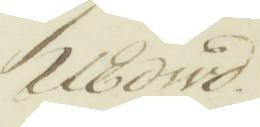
UEdwd
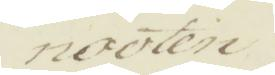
nooten
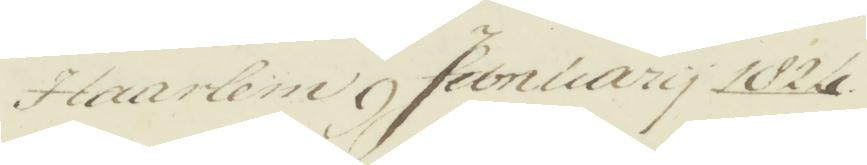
Haarlem 9 februarij 1824.
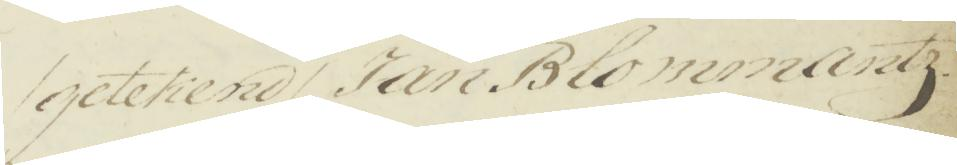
/getekend/ Jan Blommantz
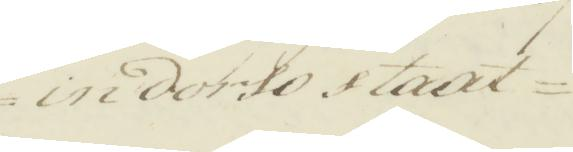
=in dorso staat=
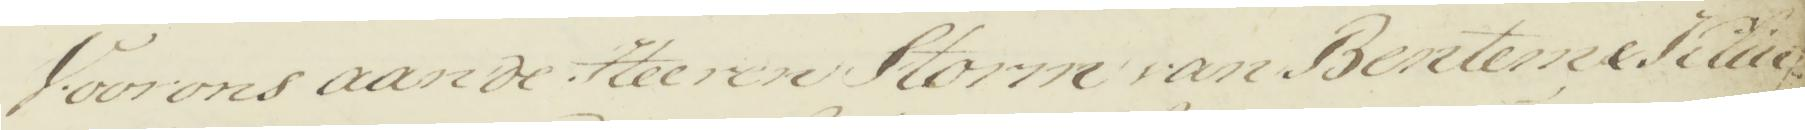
Voor ons aan de Heeren Storm van Bentem & Kluij
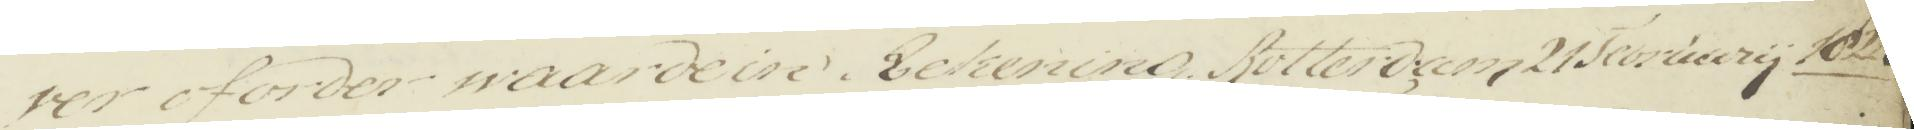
ver of order waarde in Rekening. Rotterdam 21 Februarij 1827
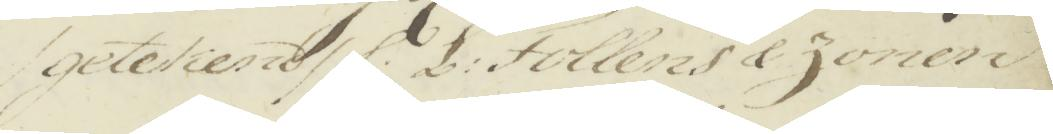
/getekend/ C. L: Tollens & Zonen
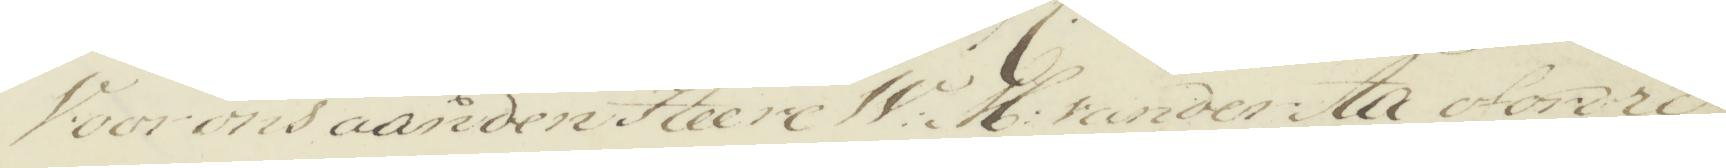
Voor ons aan den Heere W: M: vander Aa of ordre
